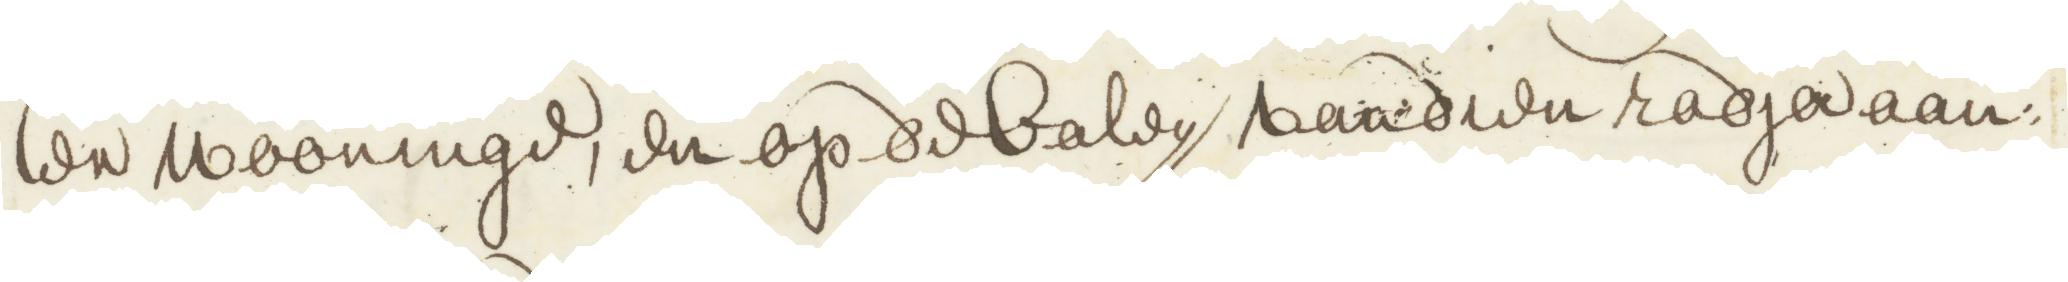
ter wooninge, en op de baleij van dien radja aan:
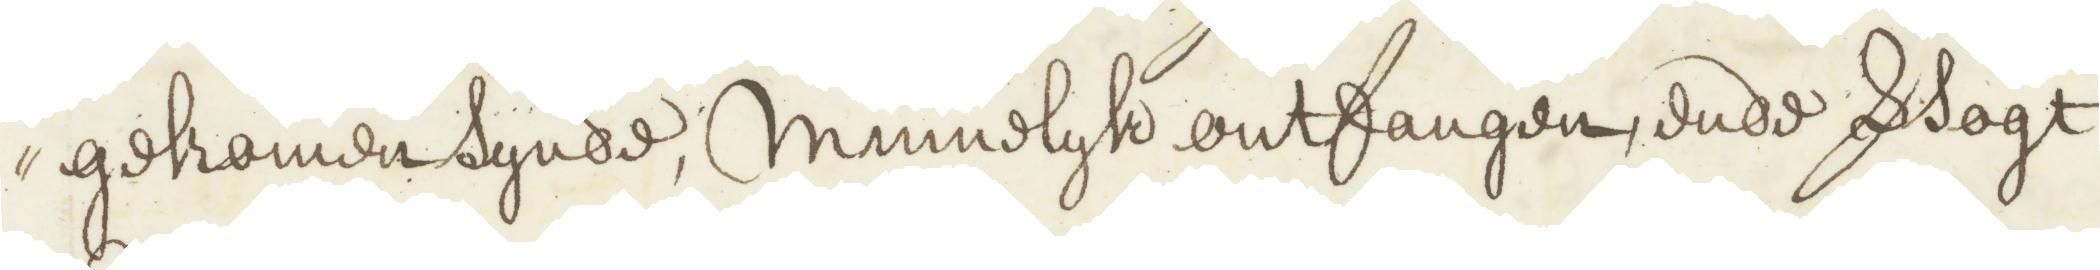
„gekomen synde, minnelyk ontfangen, ende versogt
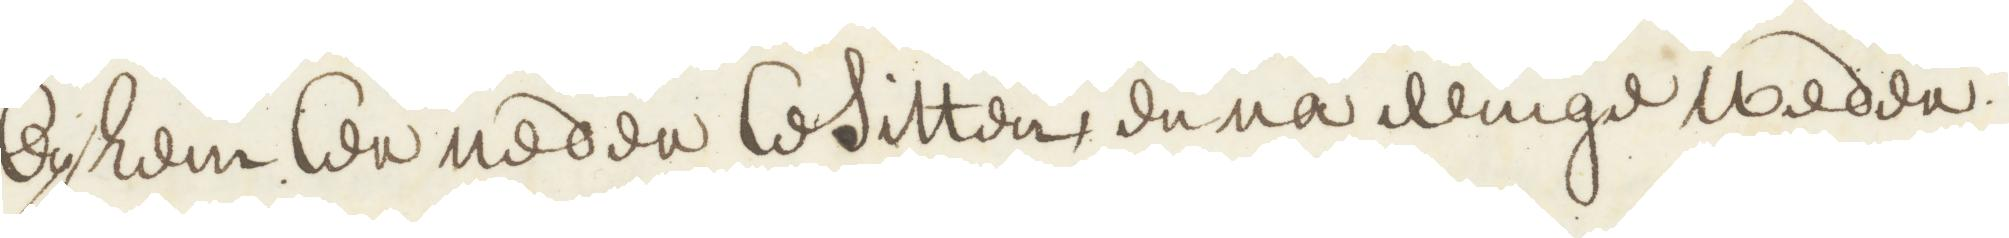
by hem ter neder te sitten, en na eenige weder
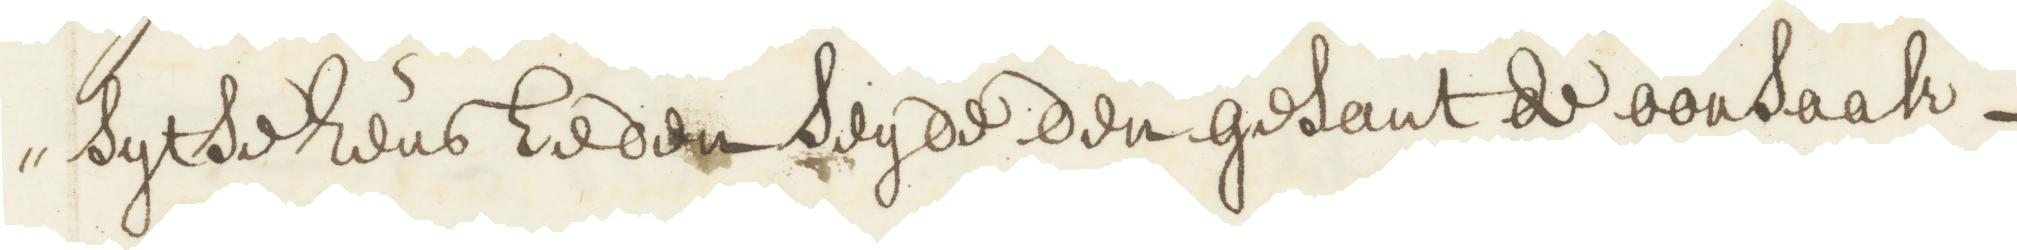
„sytse heusheden seyde den gesant de oorsaak
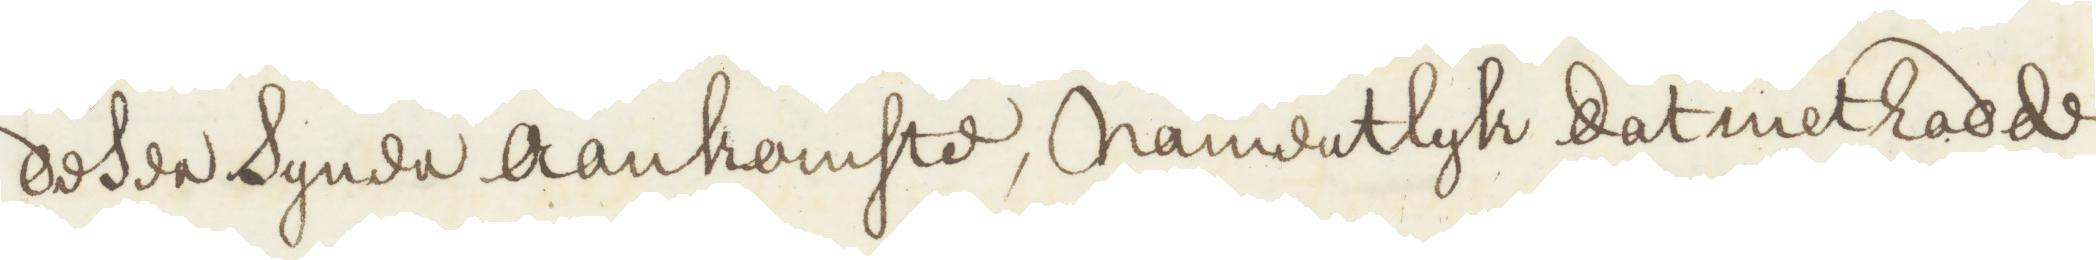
deser syner aankomste, namentlyk dat niet hadde
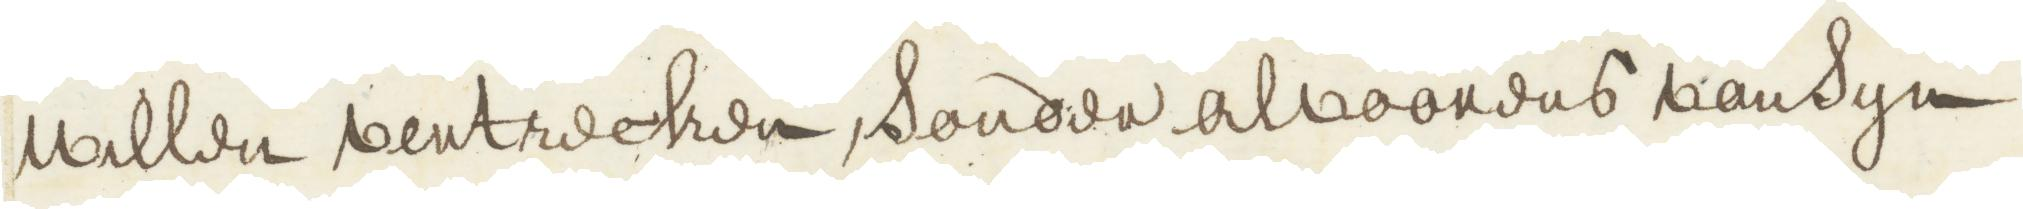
willen vertrecken, sonder alvoorens van syn
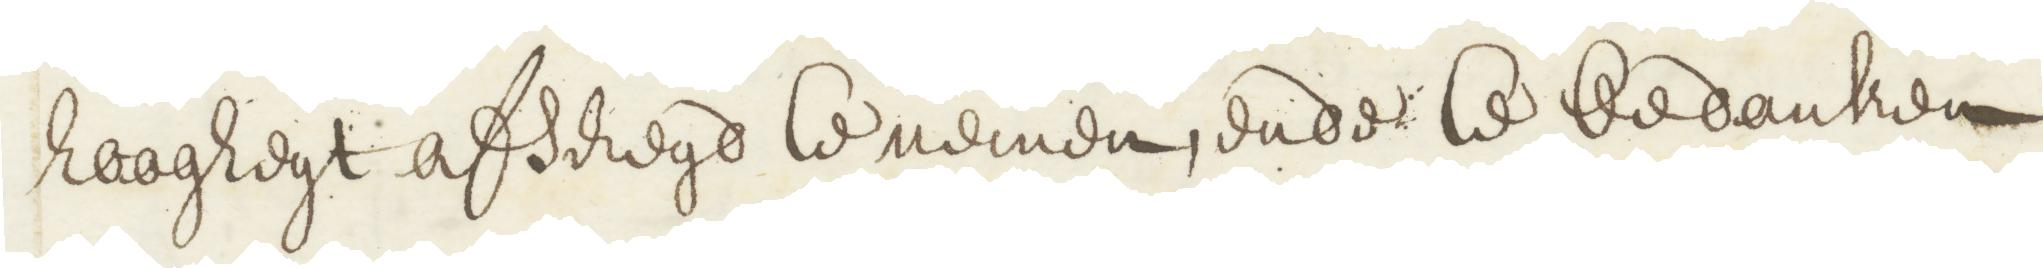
hoogheyt afscheyd te nemen, ende te bedanken
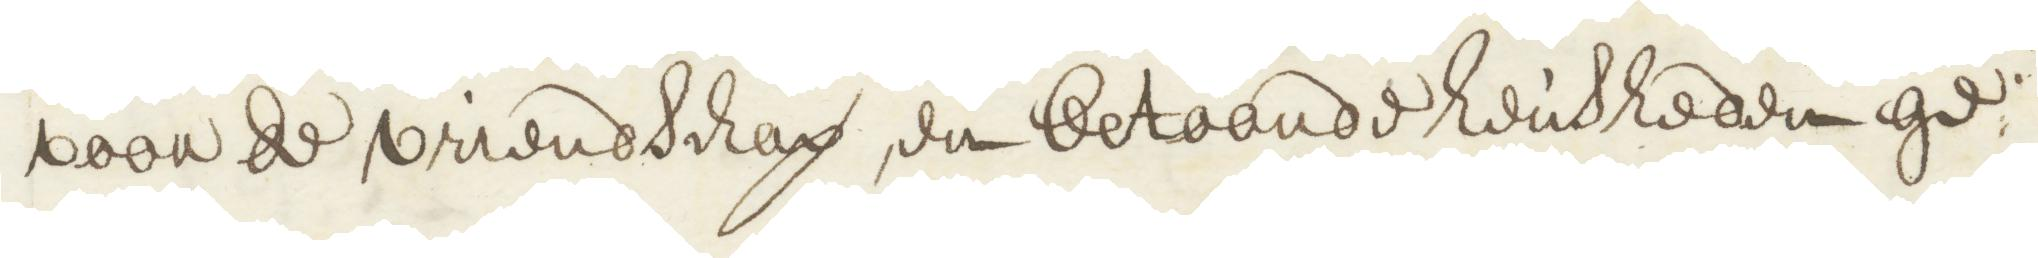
voor de vriendschap, en betoonde heusheden ge„
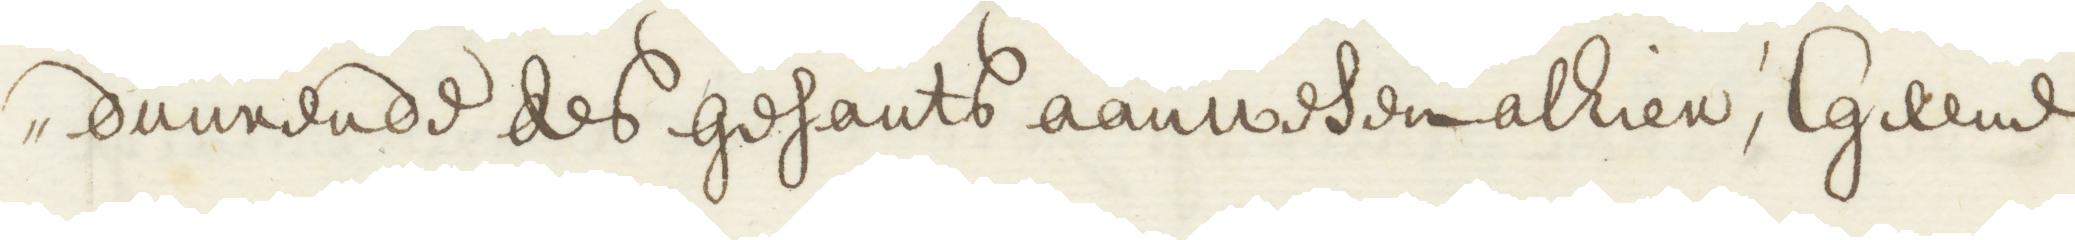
„duurende des gesants aanwesen alhier, 't geene
